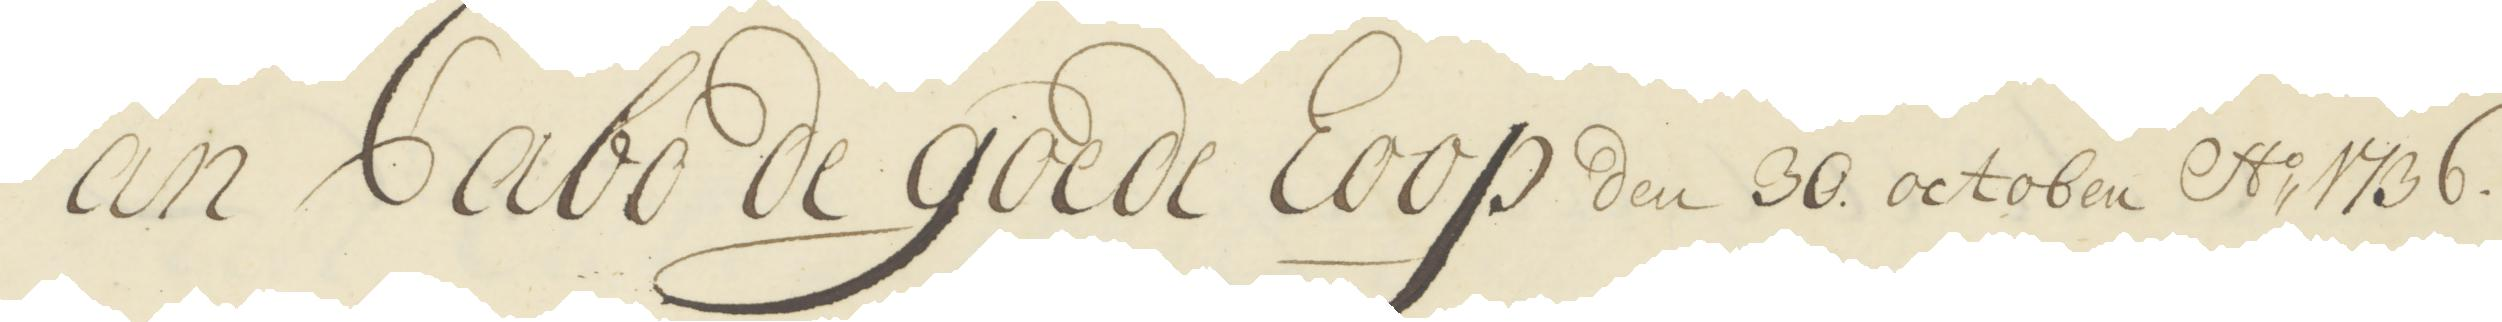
Van Cabo de goede hoop den 30. october A„o 1736.
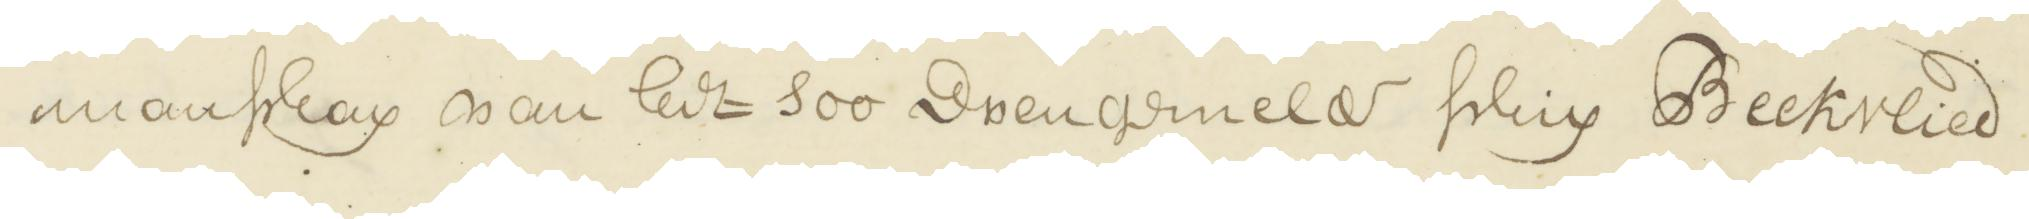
manschap van het soo Evengemelde schip Beekvlied
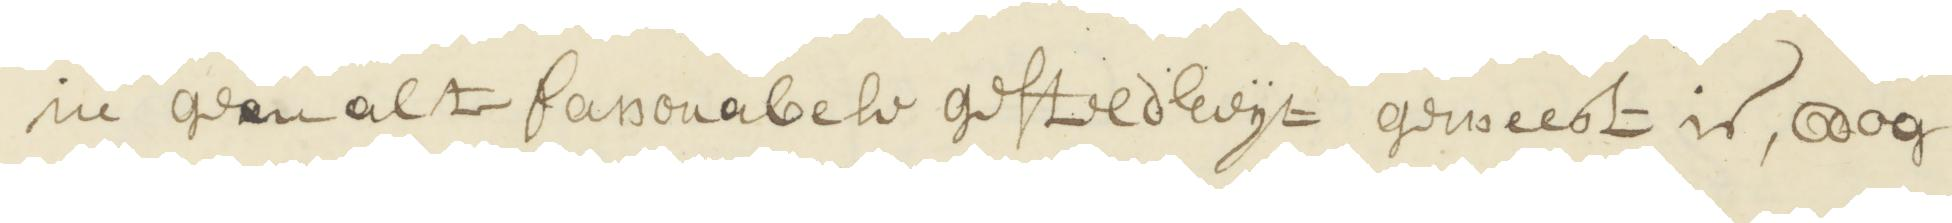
in geen al te favorabele gesteldheijt geweest is, dog
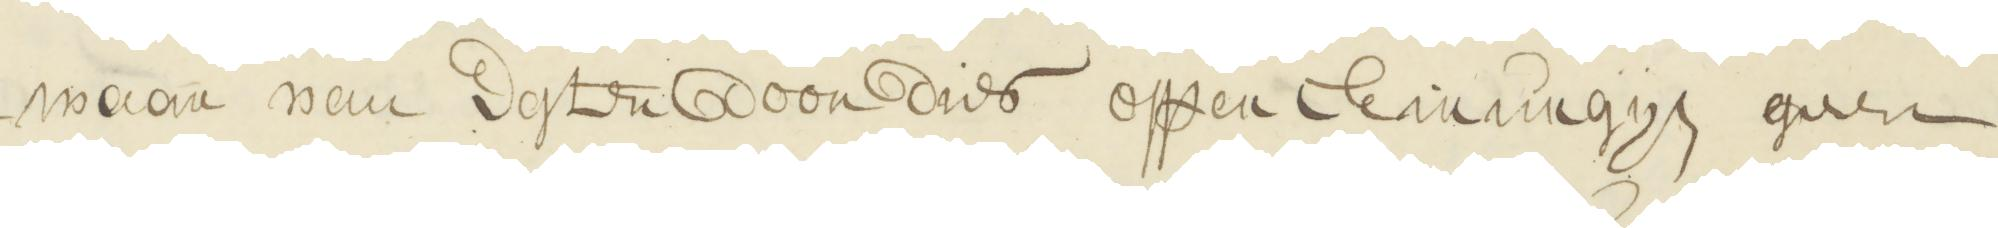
waar van Egter door dies opper chirurgijn geen
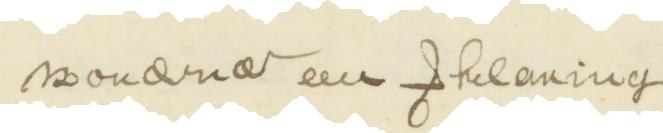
wordende een verklaring
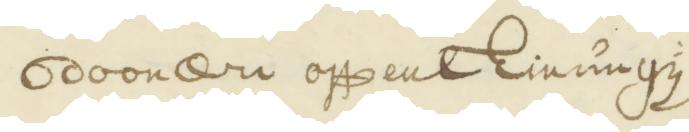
door den opper Chirurgijn
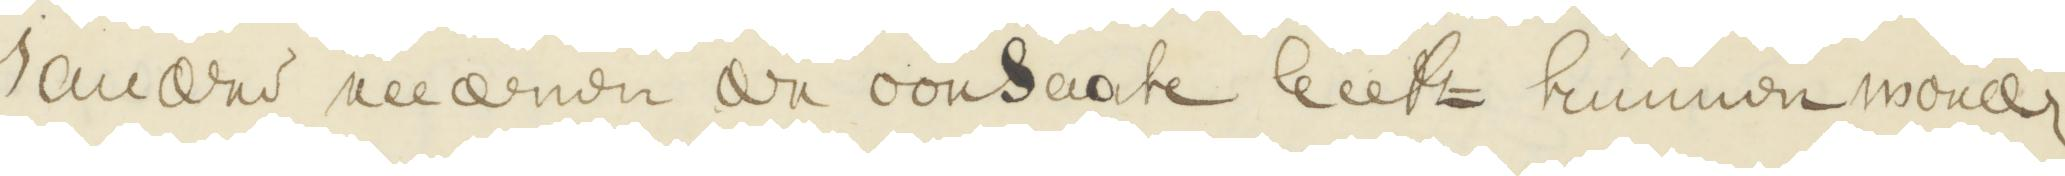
andere reedenen der oorsaak heeft kunnen worden
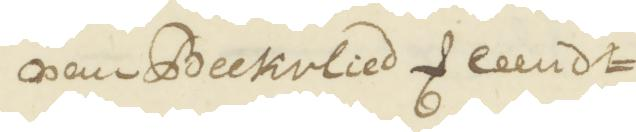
van Beekvlied verleendt
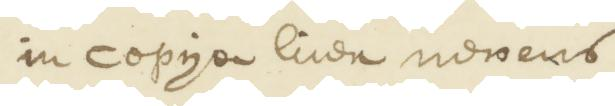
in copija hier nevens
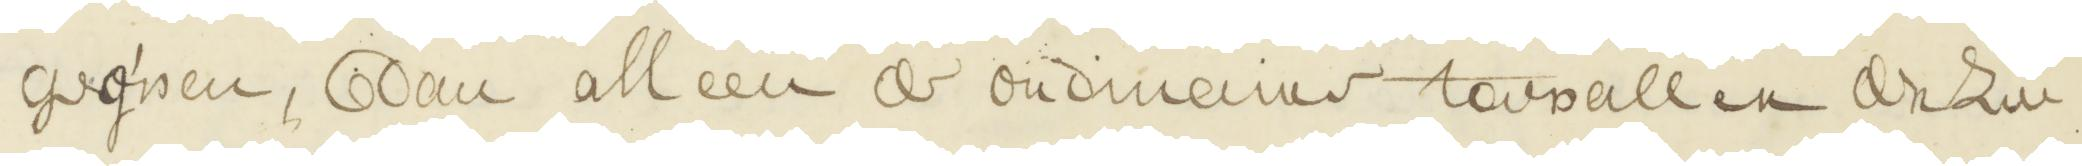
geg'ven, dan alleen de ordinaire toevallen der zee
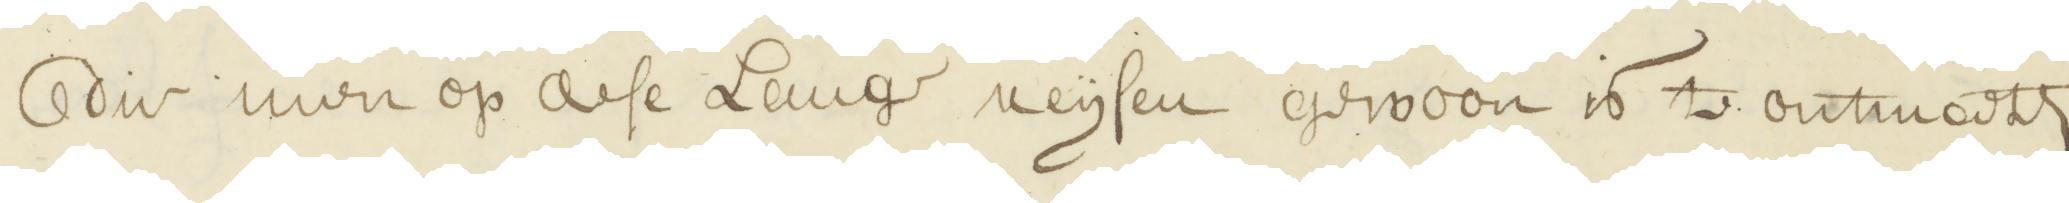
die men op dese lange reijsen gewoon is te ontmoeten
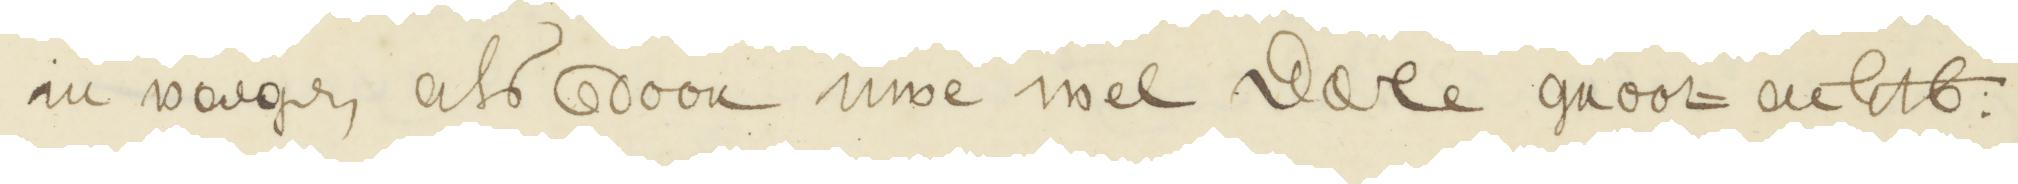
in voegen als door uwe wel Edele groot achtb:
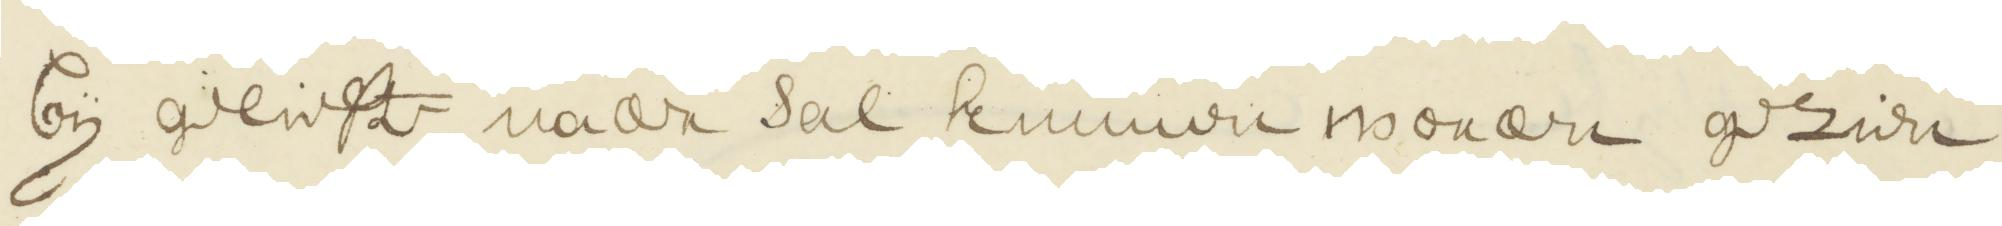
bij geliefte nader sal kunnen worden gezien
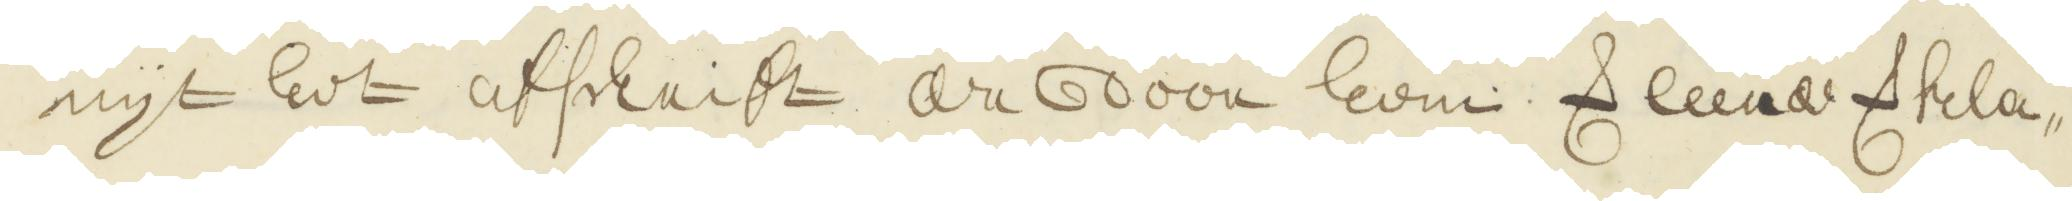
uijt het afschrift der door hem verleende verkla„
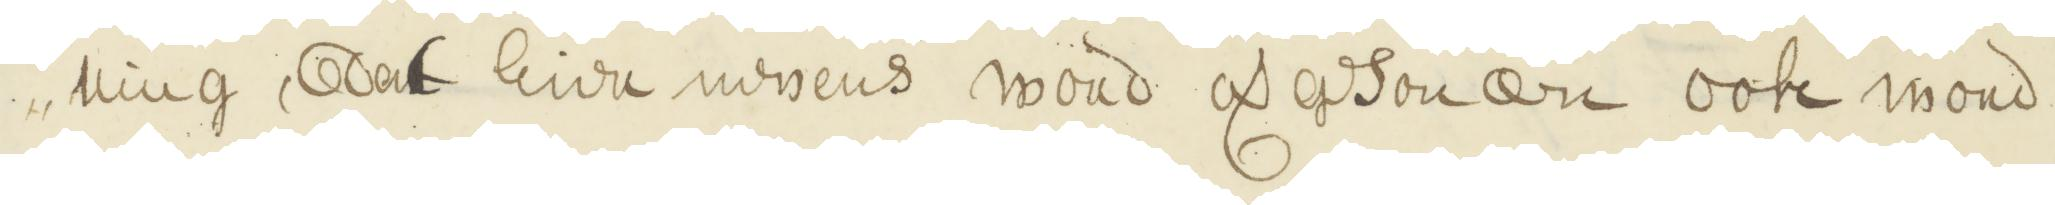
„ring dat hier nevens word overgesonden ook word
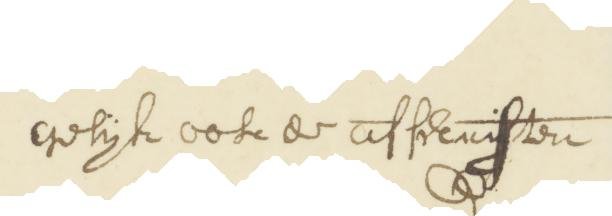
gelijk ook de afschriften
